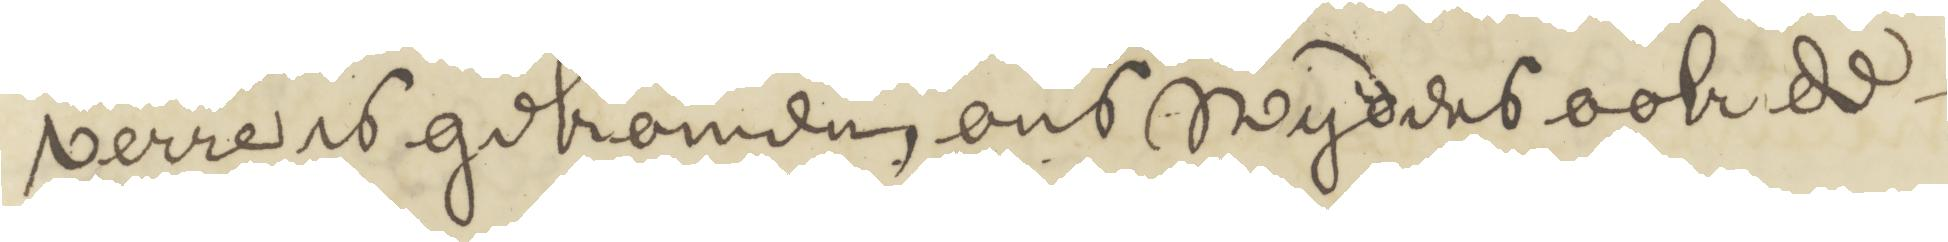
verre is gekomen, ons wijders ook de -
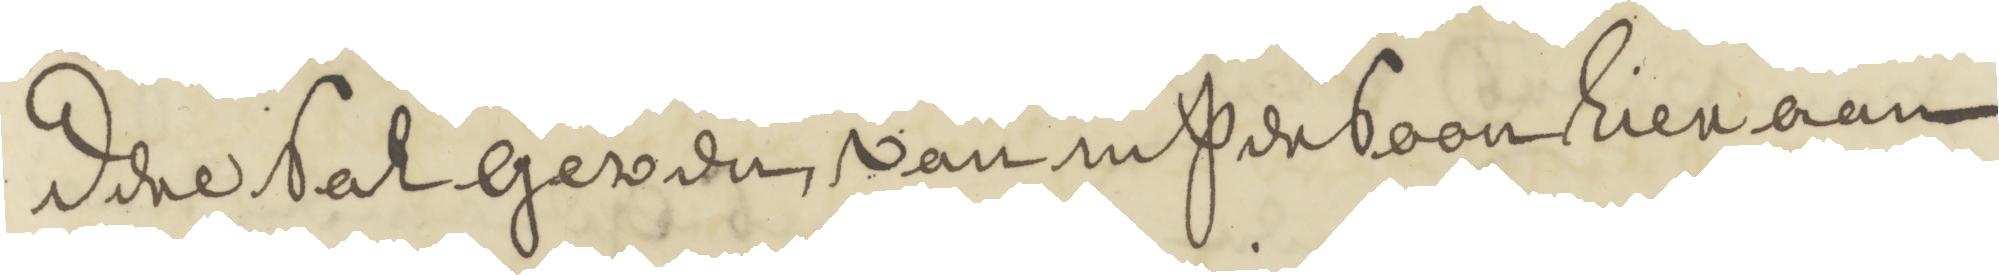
Eere sal geven, van inpersoon hier aan—
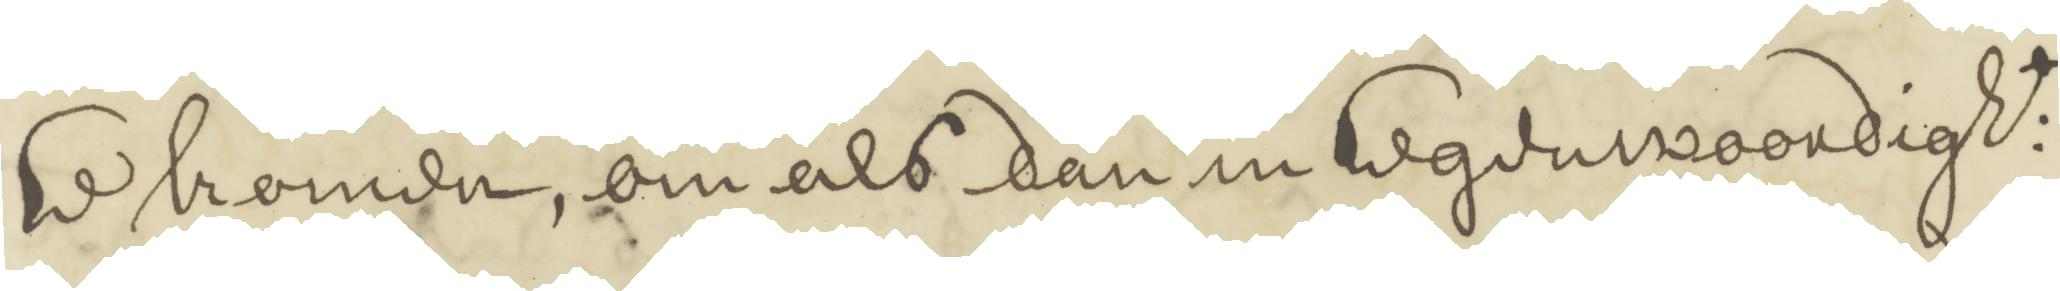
te komen, om als dan in tegenwoordigh:t
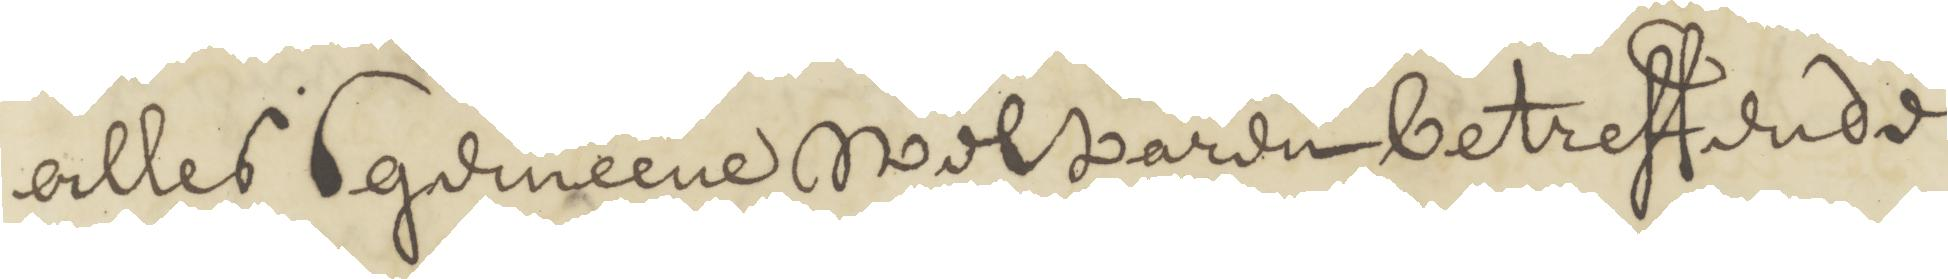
alles .t gemeene welvaren betreffende
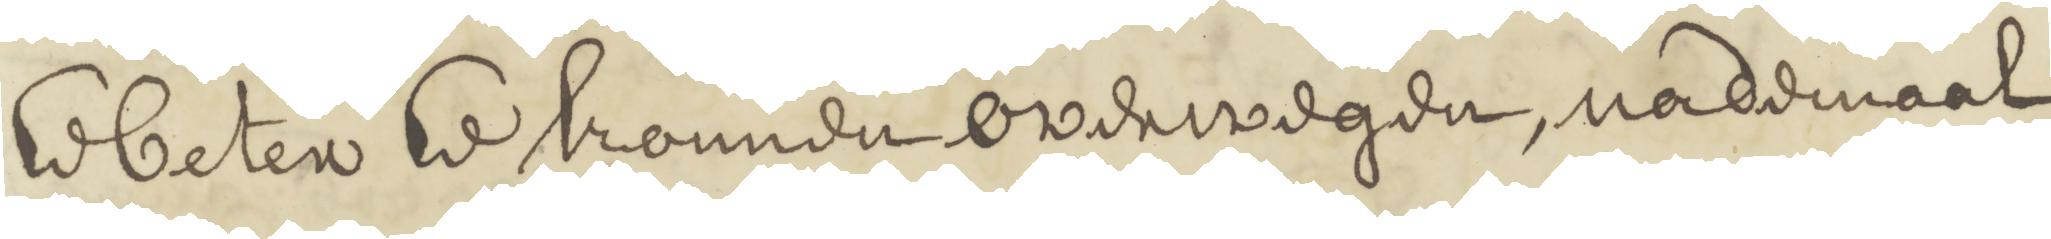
tebeter te konnen overwegen, nademaal
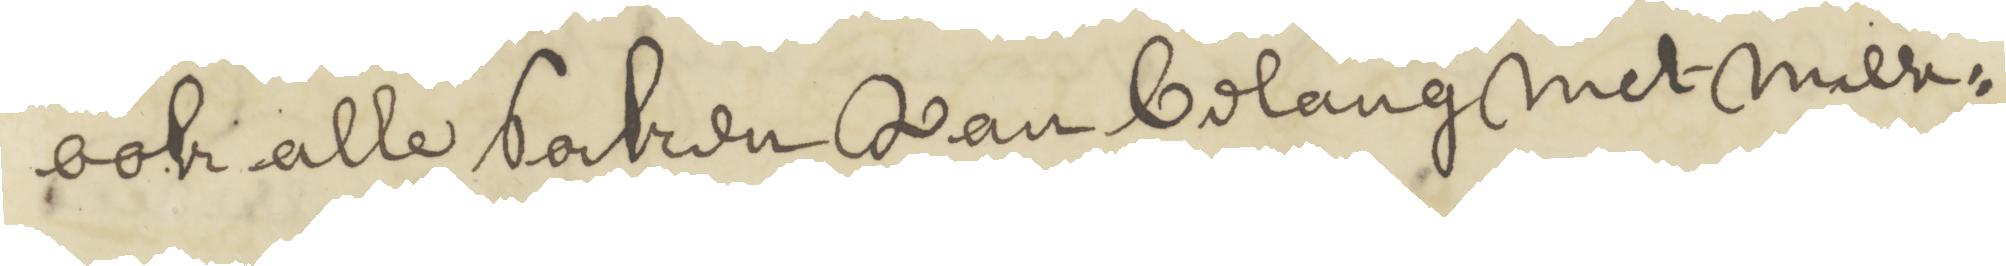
ook alle saken van belang met meer„
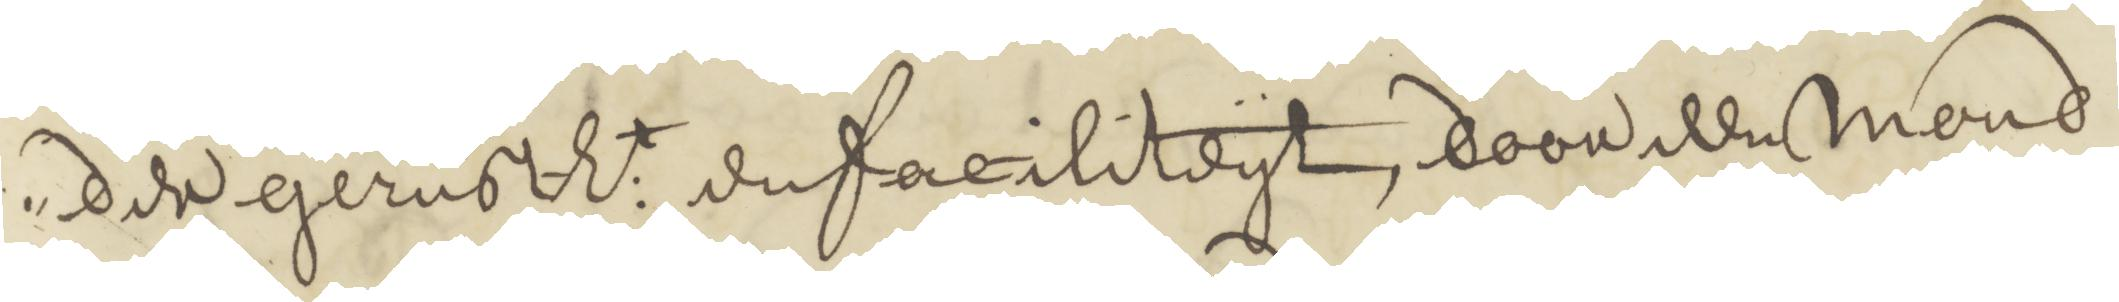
„der gerusth:t enfaciliteijt, door een mond
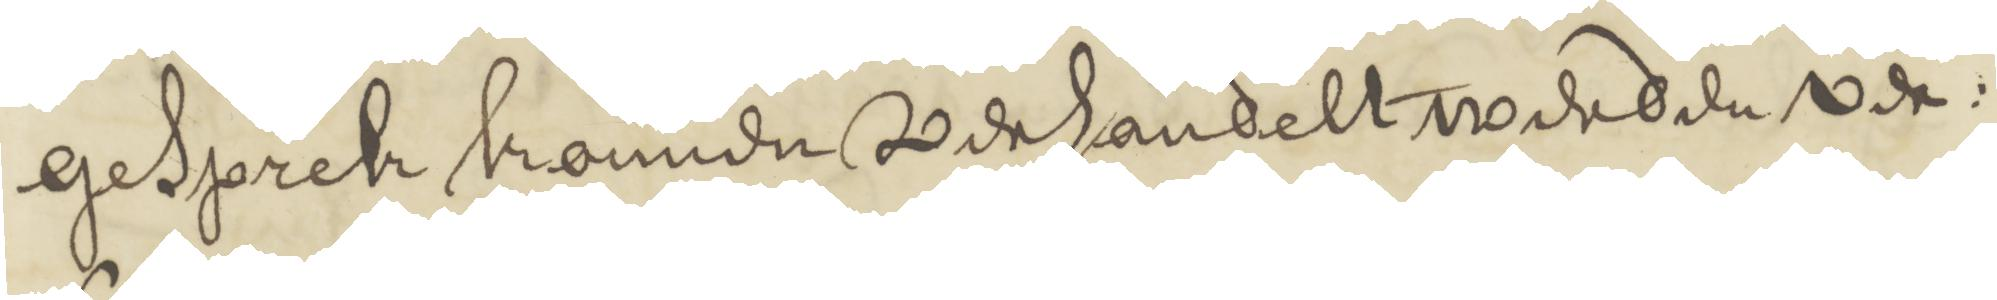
gesprek konnen verhandelt werden ver„
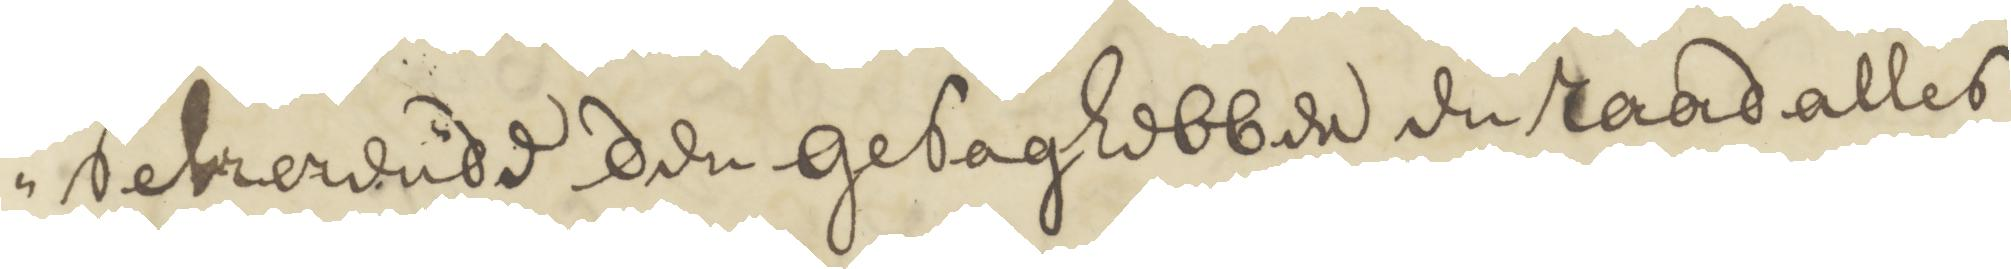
„sekerende den gesaghebber en raad alles
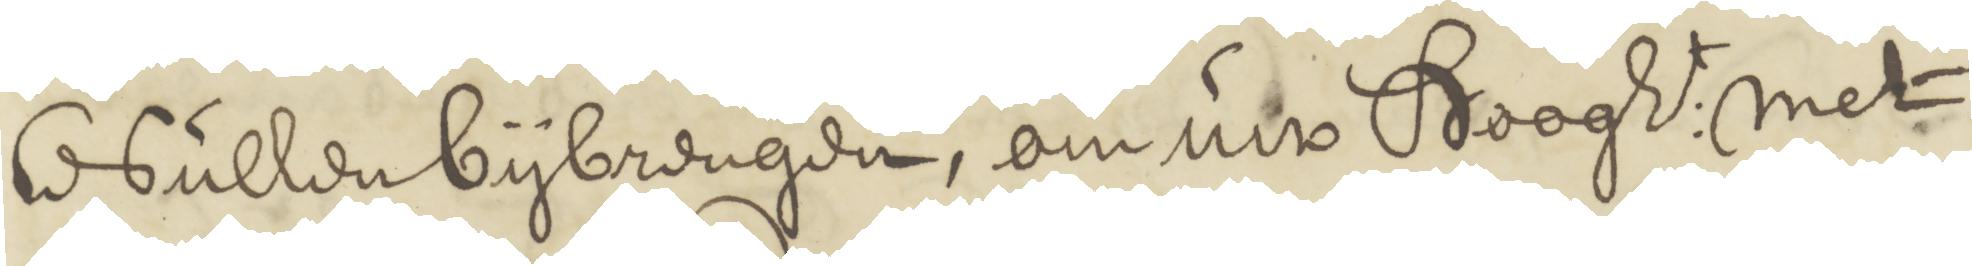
tesullen bijbrengen, om uw Hoogh:t met
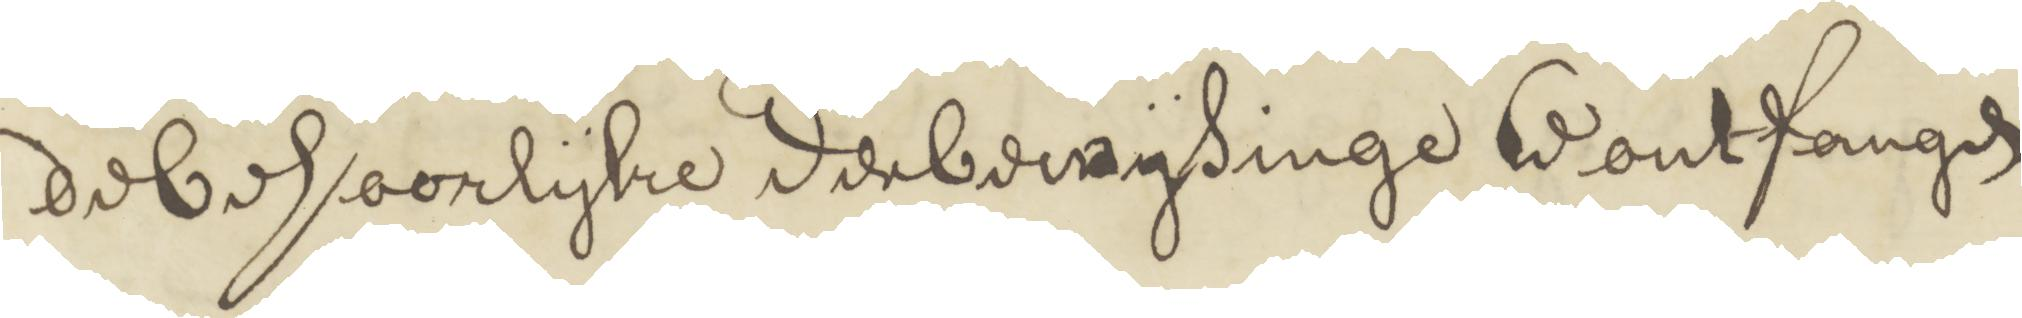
debehoorlijke Eerbewijsinge te ontfangen
